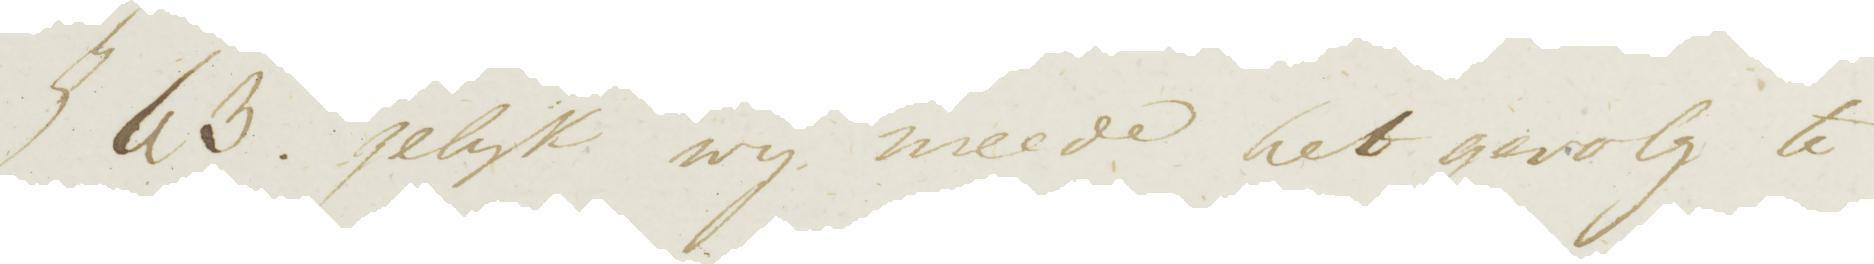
§ 43. gelyk wy meede het gevolg te
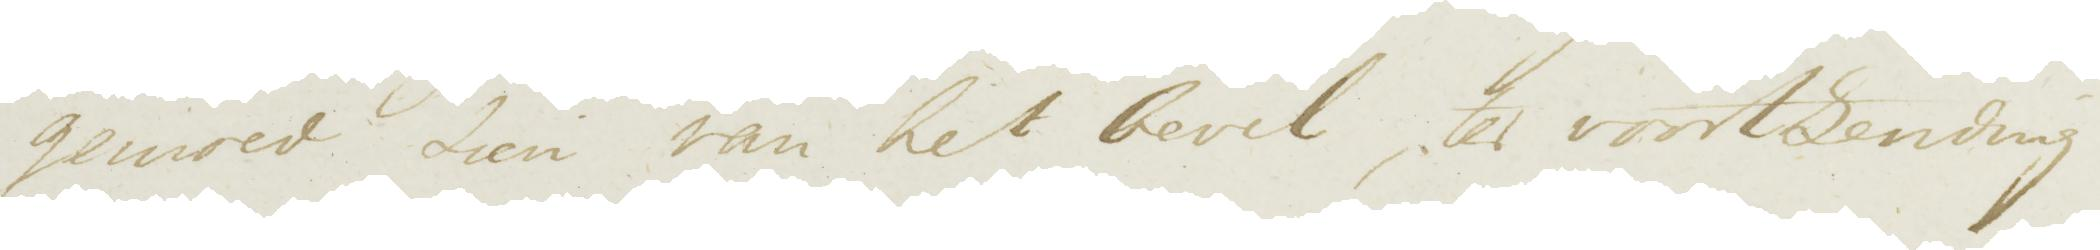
gemoed zien van het bevel ,ter voortzending
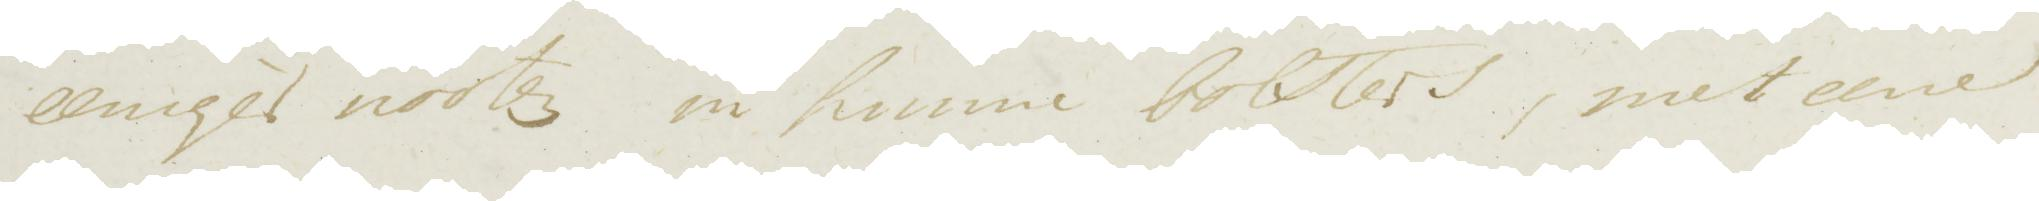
eeniger nooten in hunne bolsters , met eene
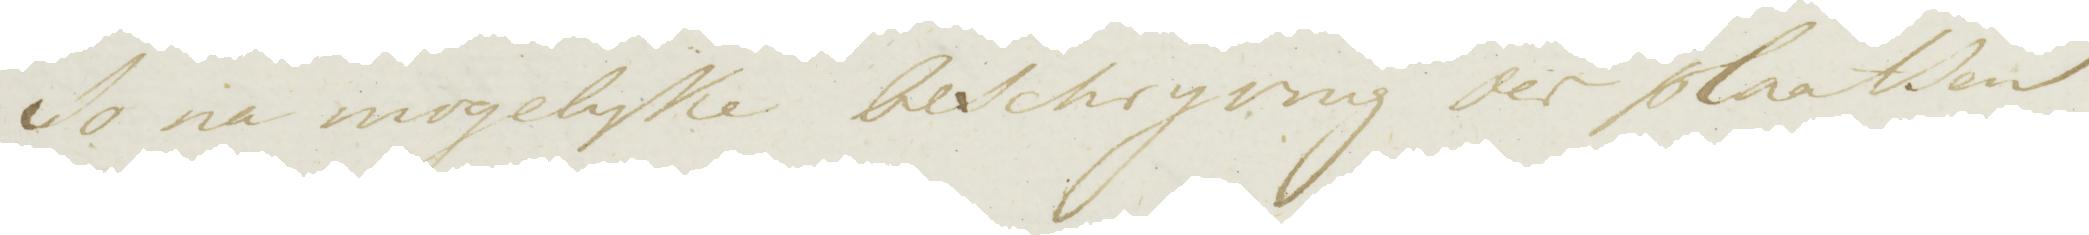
so na mogelyke beschryving der plaatsen
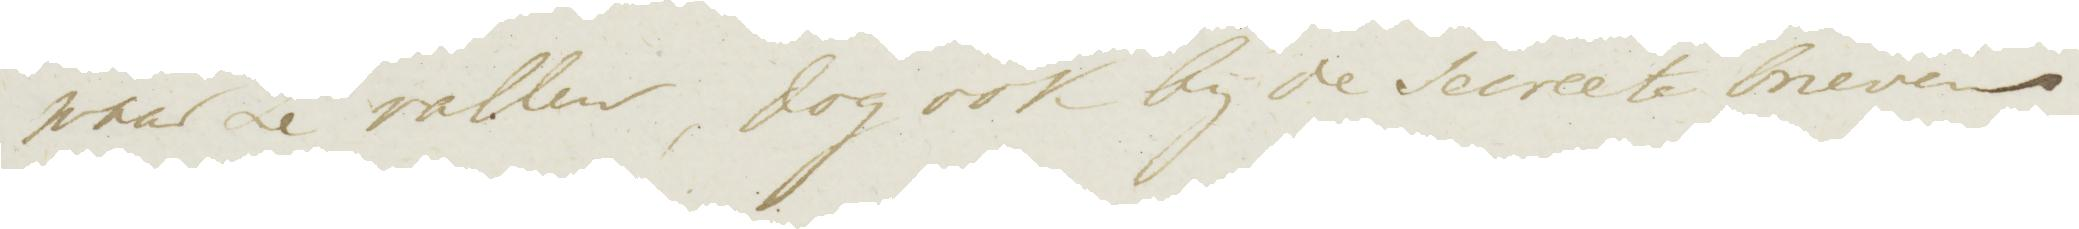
waar ze vallen , dog ook bij de secreete brieven
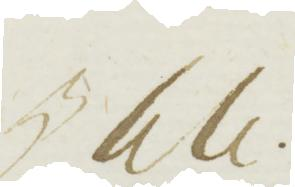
§44.
